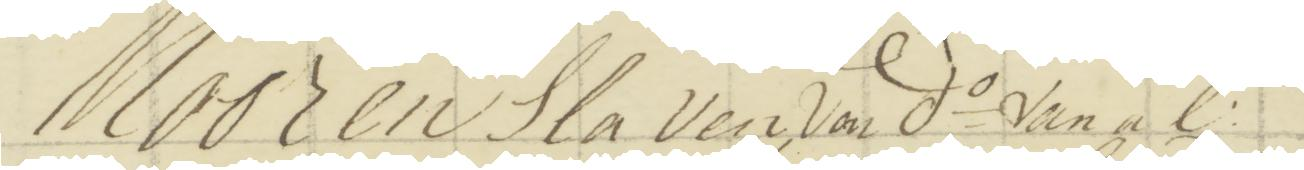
Mooren Slaven van d=o Van al:
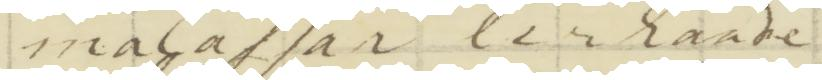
macassar ler hande
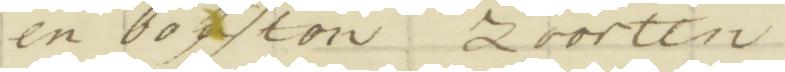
en bouton zoorten
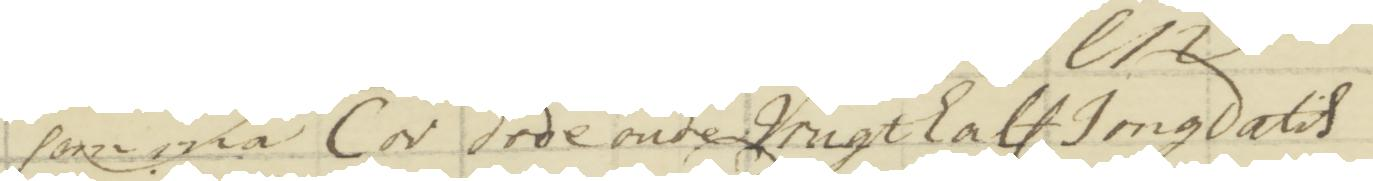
somma Cor dode onde Vrugt half Jong datis
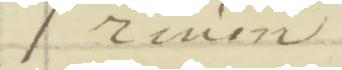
ruim
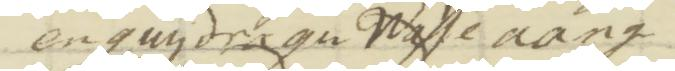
en quy dragen wasse aang
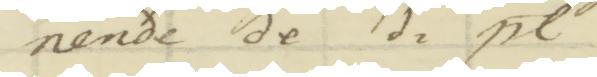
nende de di pl
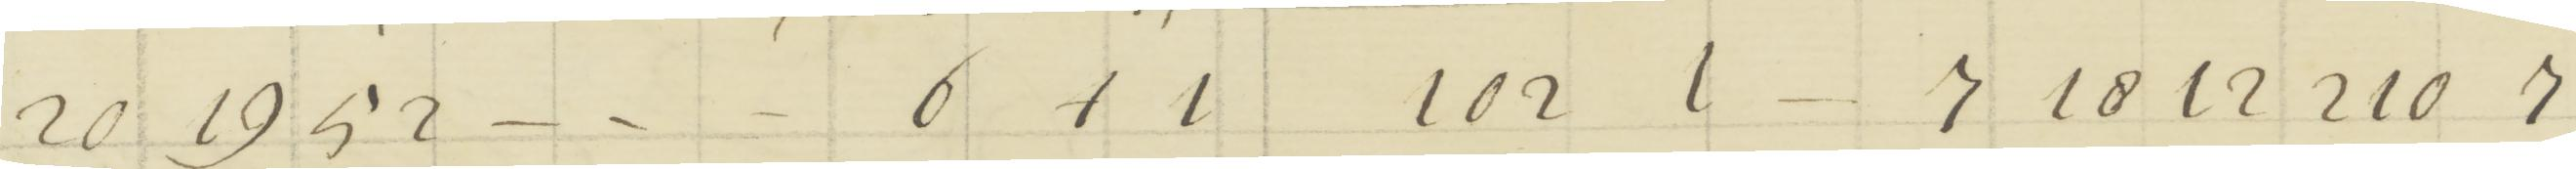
20 19 52 – – – 6 4 1 102 1 — 7 18 12 210 7
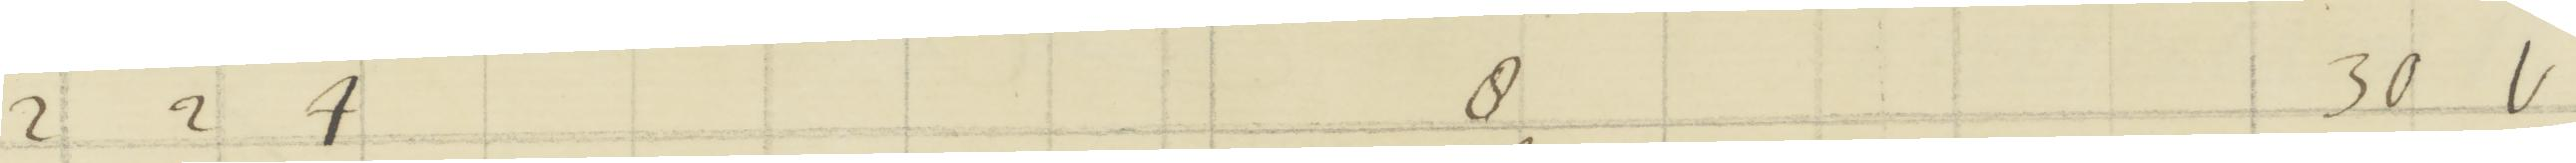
2 2 4 8 30 1
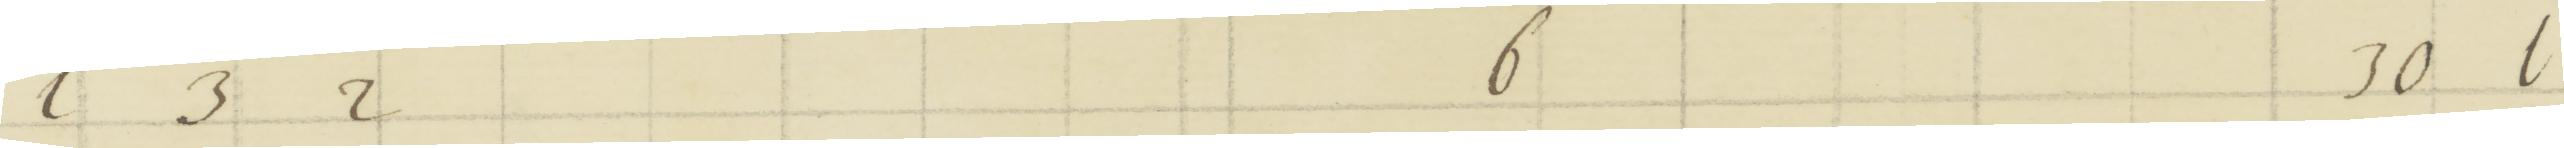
1 3 2 6 30 1
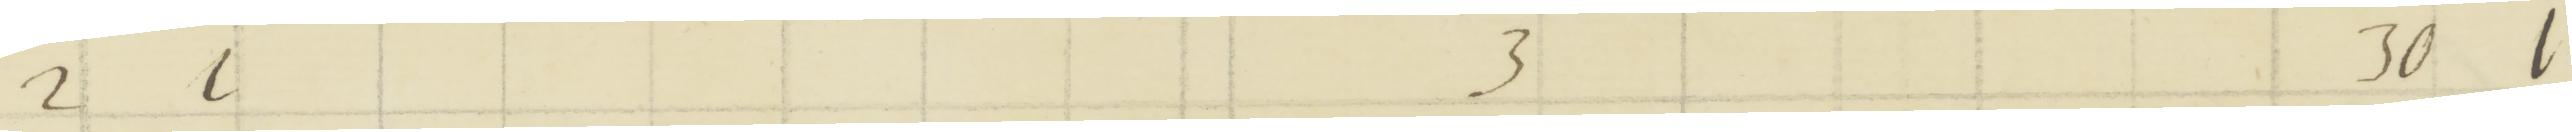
2 1 3 30 1
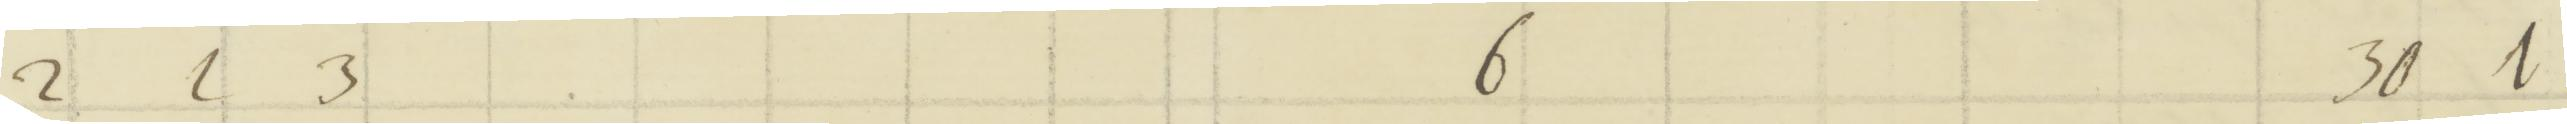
2 1 3 6 30 1
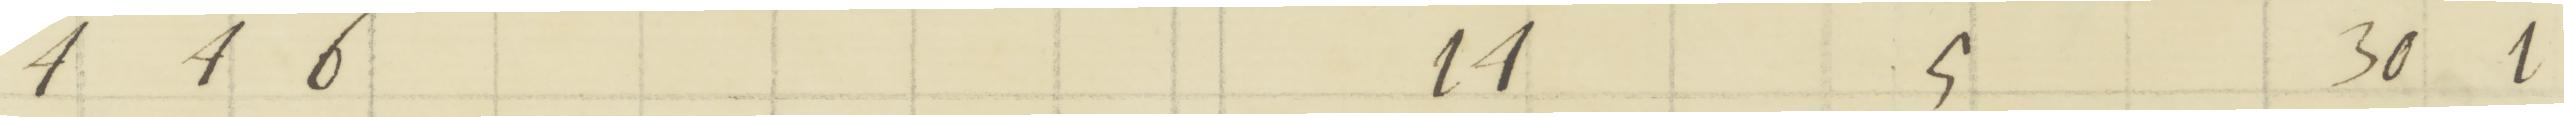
4 4 6 14 5 30 1
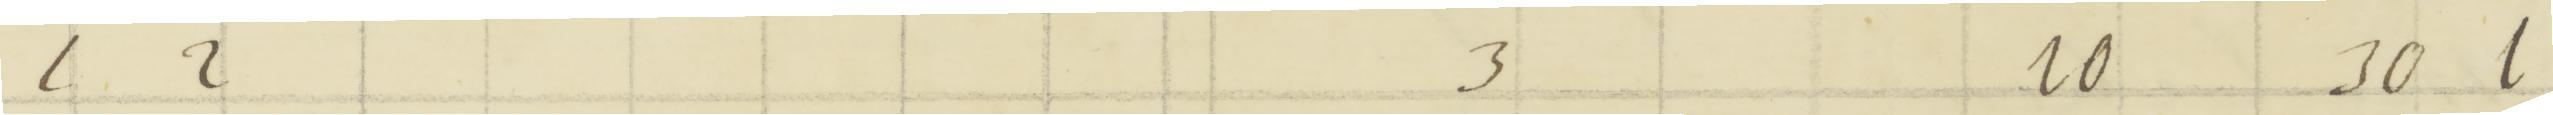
1 2 3 10 30 1
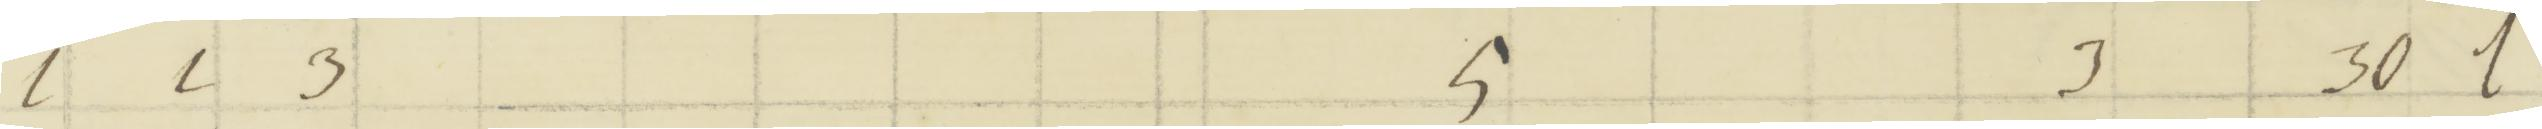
1 1 3 5 3 30 1
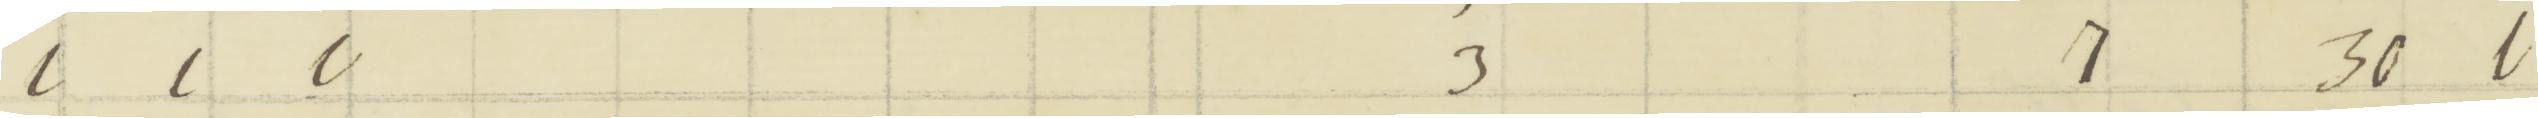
1 1 1 3 7 30 1
